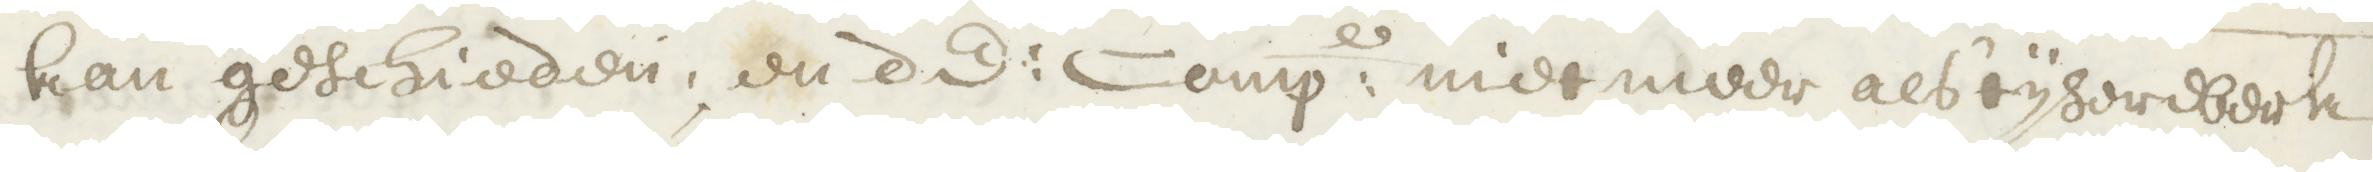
kan geschieden, en dE: Comp:e niet meer als 't ijserwerk
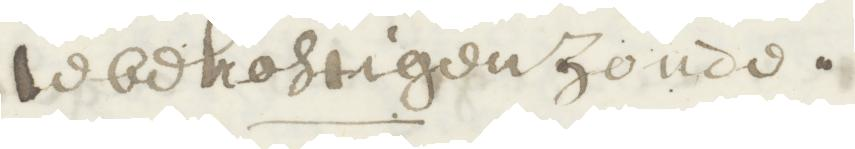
te bekostigen zoude„
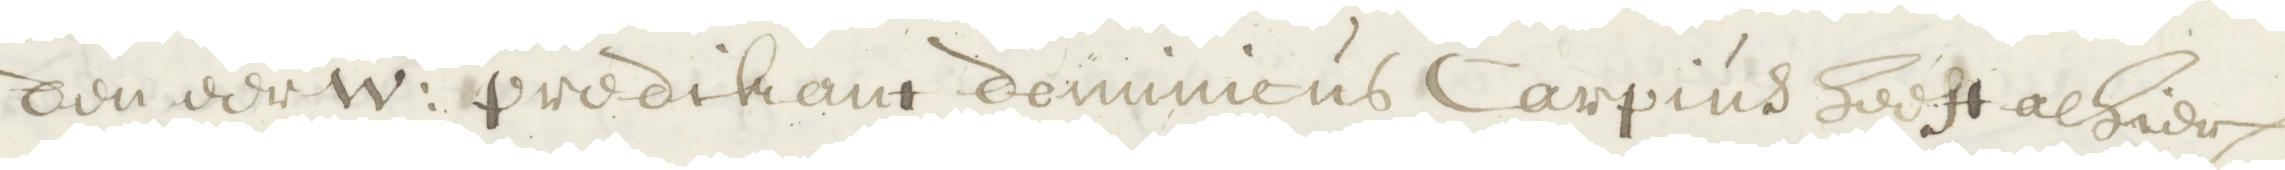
den eerw: predikant dominicus Carpius heeft alhier
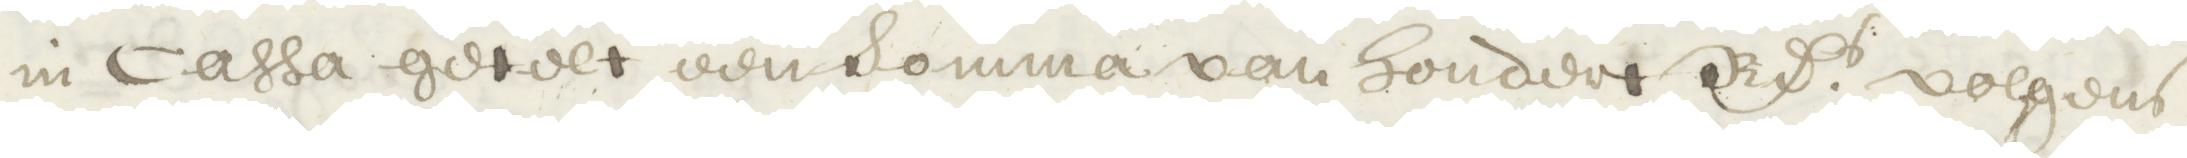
in Cassa getelt een somma van hondert Rd.s volgens
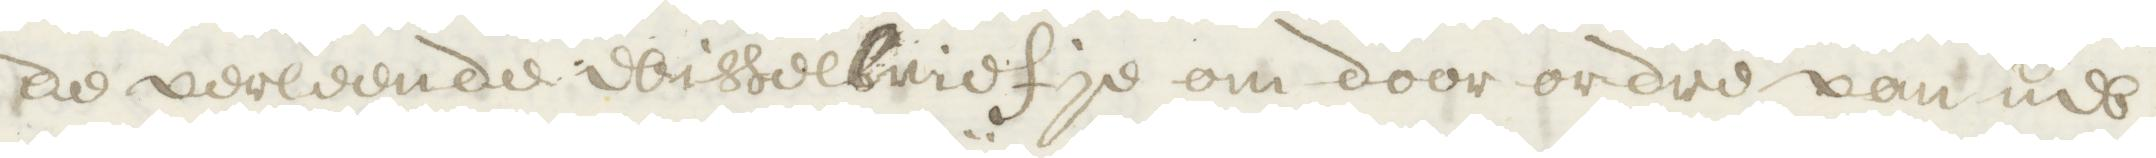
de verleende wisselbriefje om door ordre van uw
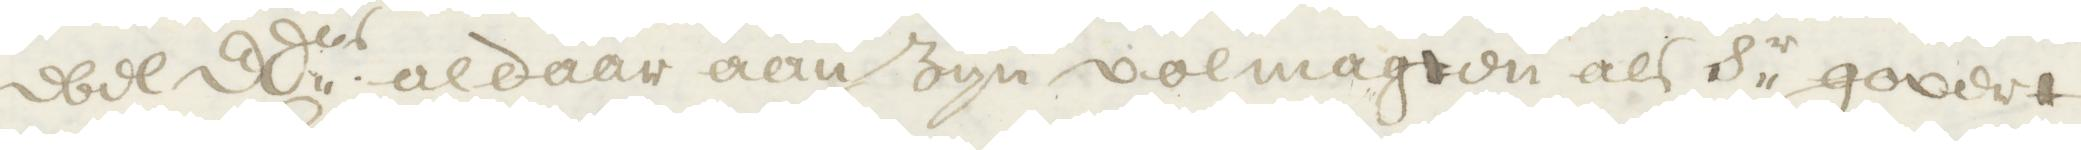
wel ED„le aldaar aan zijn volmagten als s:r govert
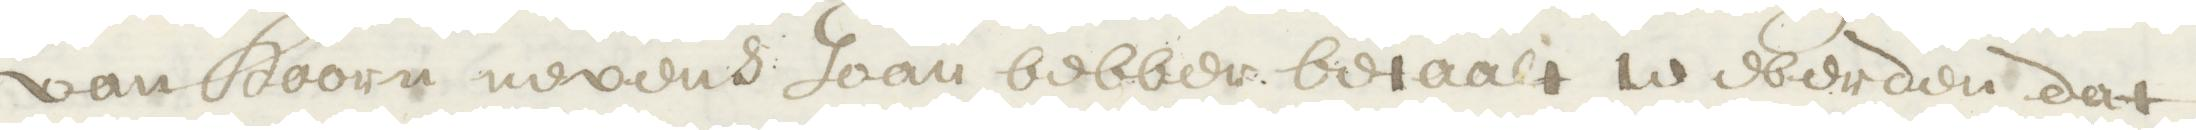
van Hoorn nevens Joan bebber. betaalt te werden dat
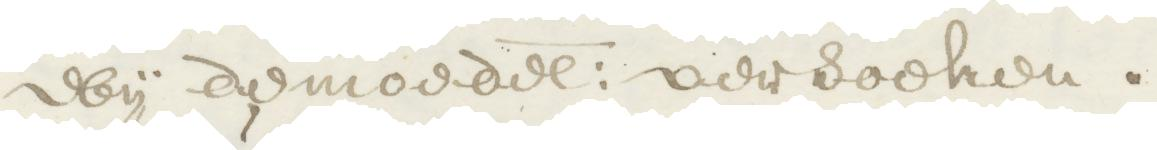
wij demoedel: versoeken.
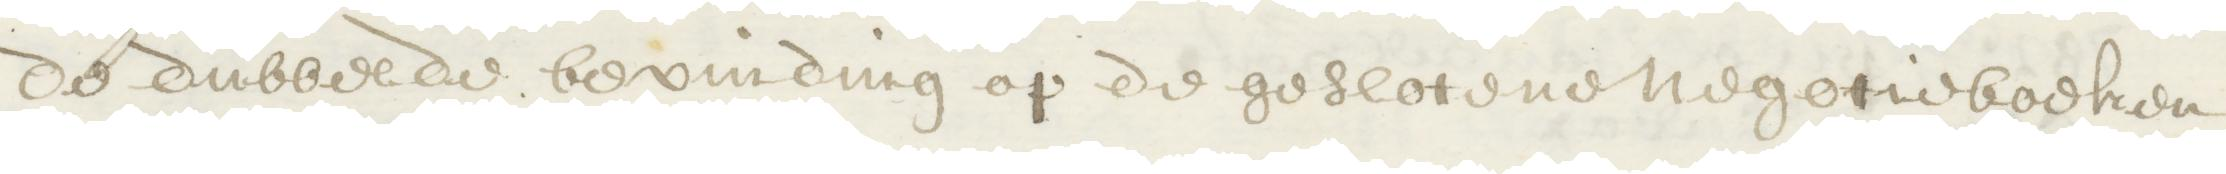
de dubbelde bevinding op de geslotene negotieboeken
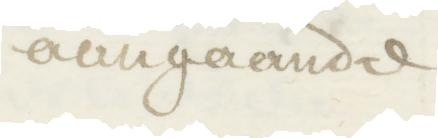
aangaande
